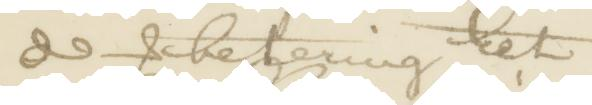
de verbetering het
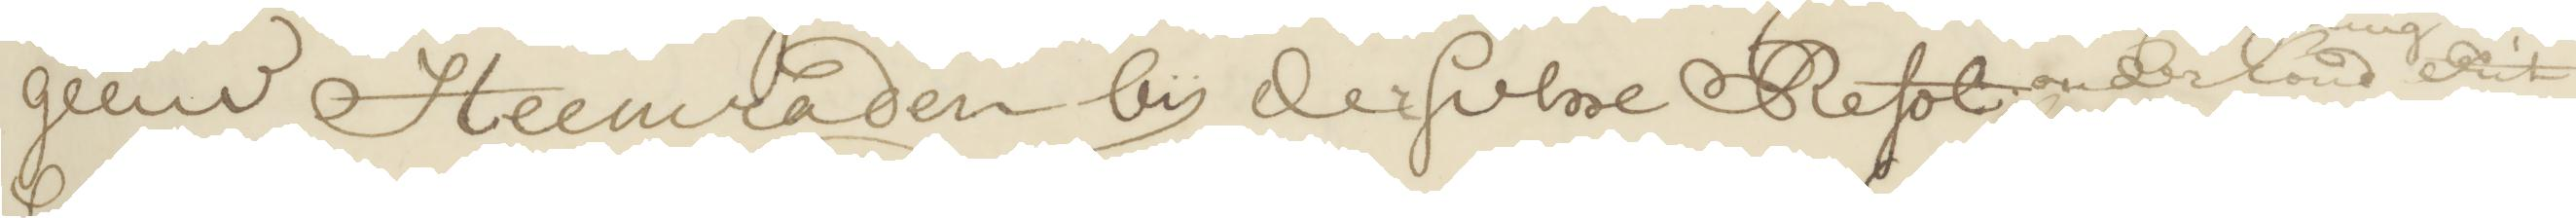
geene Heemraden bij derselve Resol: onderhoud Jn't
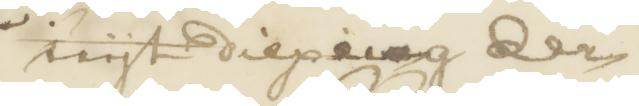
uijt dieping der
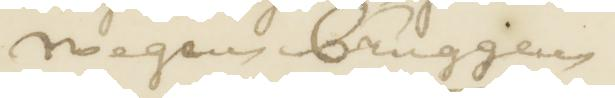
wegen bruggen
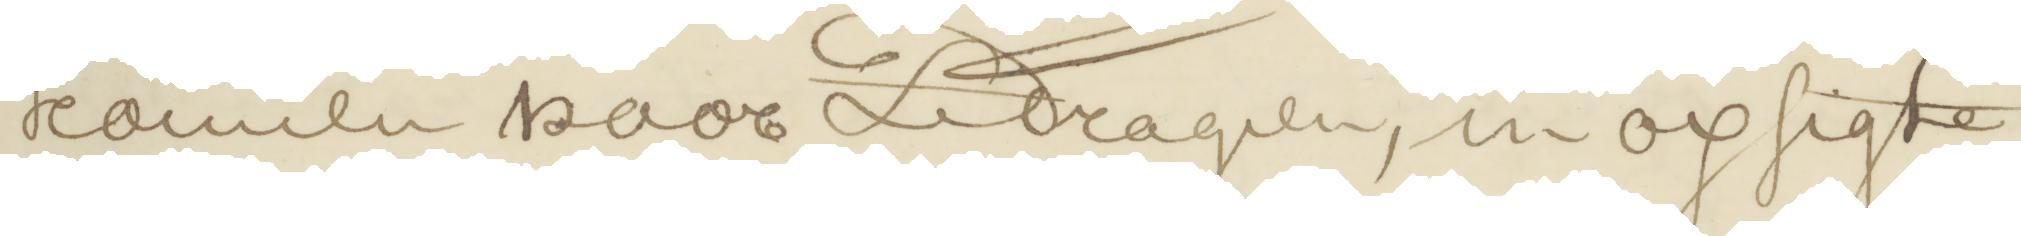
komen voor te dragen, in opsigte
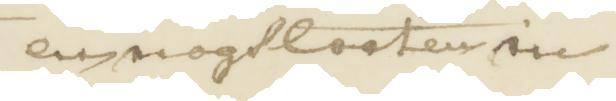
en nog slooten in
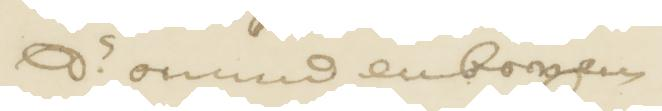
d’ omme en boven
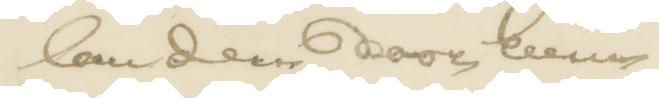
landen door heem
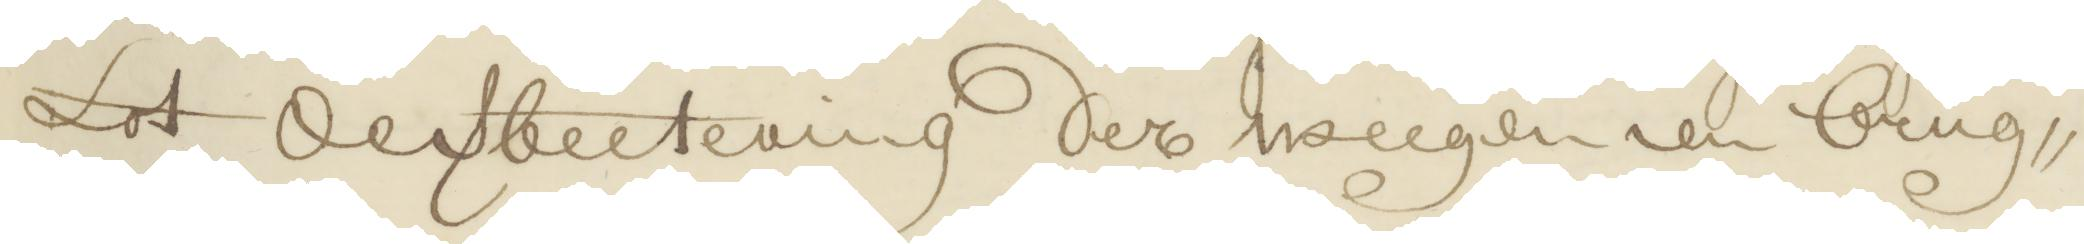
tot de verbeetering der weegen en brug„
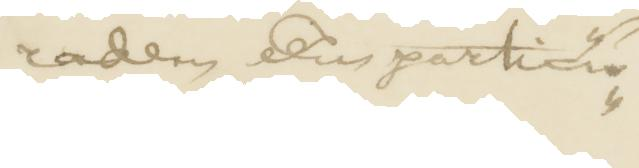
raden Jnt particu„
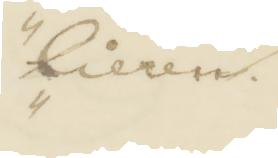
„lieren.
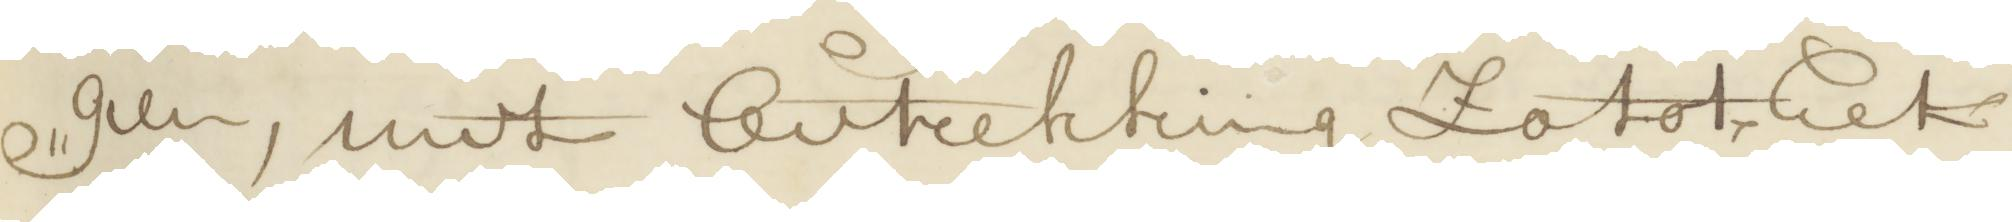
gen, met betrekking zo tot het
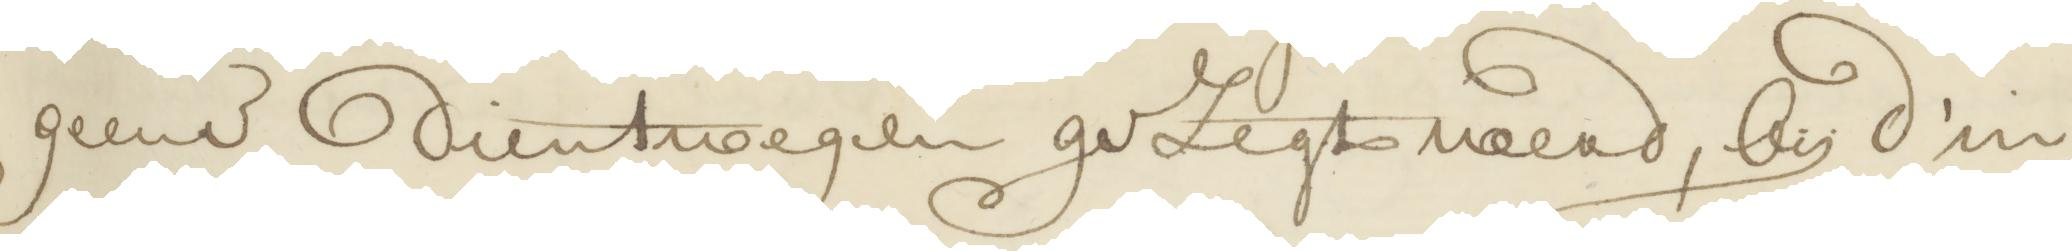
geene dientwegen gezegt werd, bij d’ in
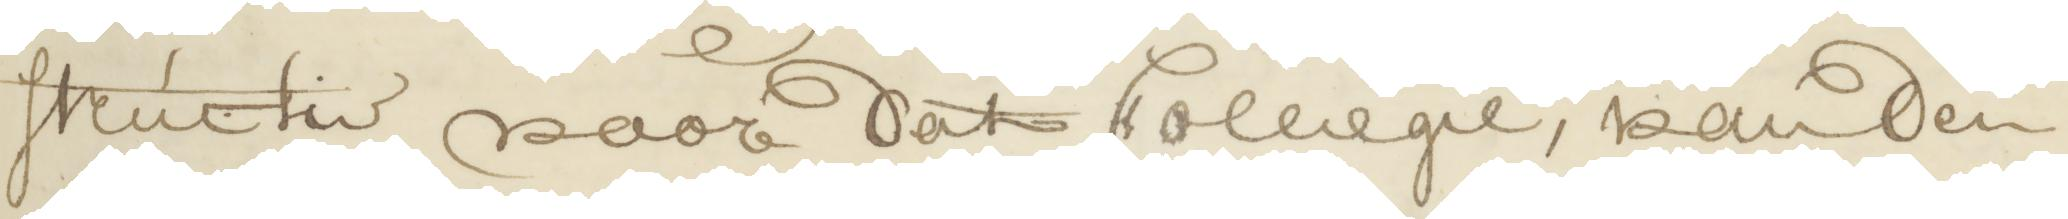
structie voor dat collegie, van den
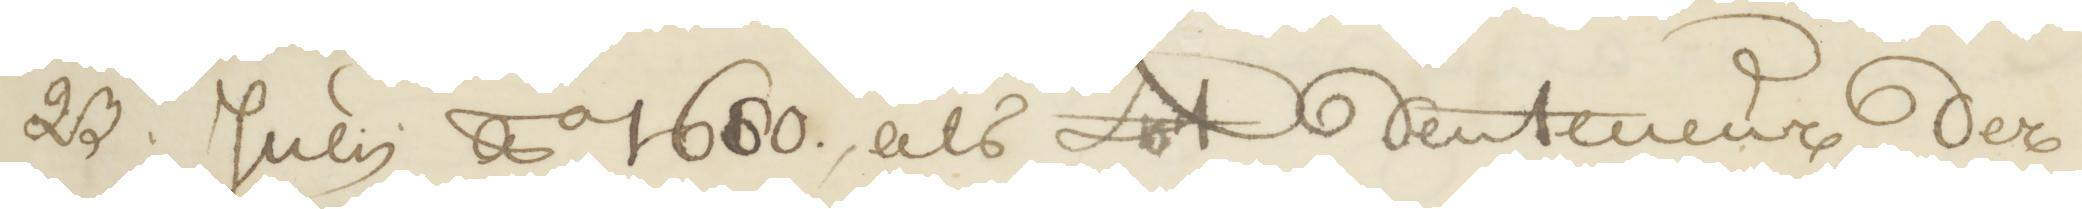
23. Julij Ao 1680., als tot den teneur der
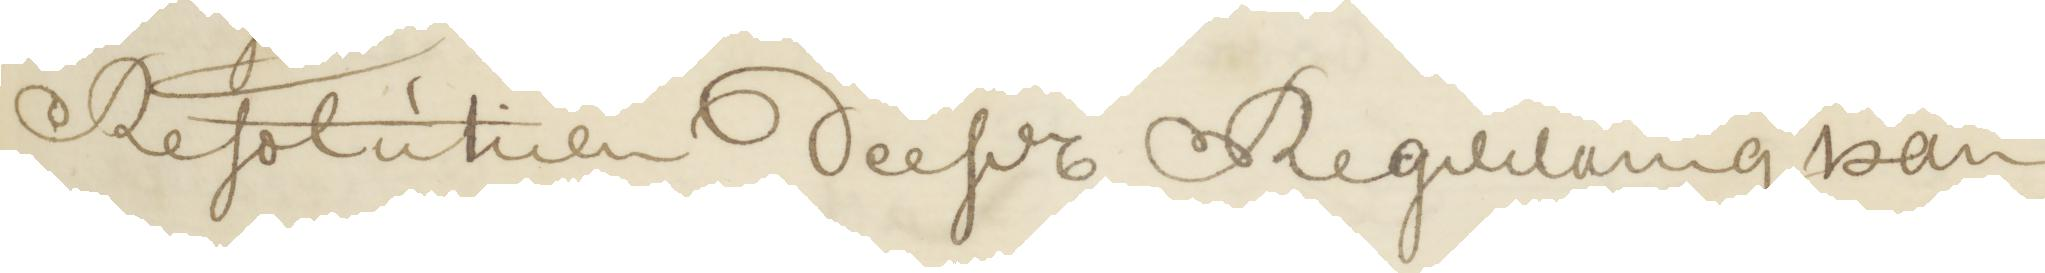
Resolutien deeser Regeering van
